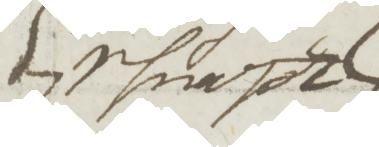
{ 1 snaph
